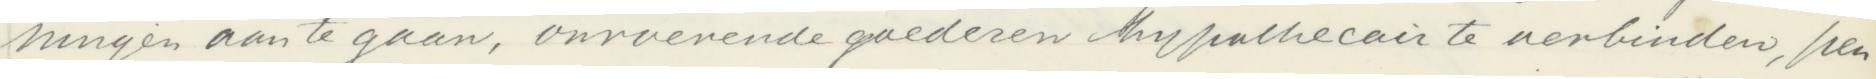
ningen aan te gaan, onroerende goederen hypothecair te verbinden, pen
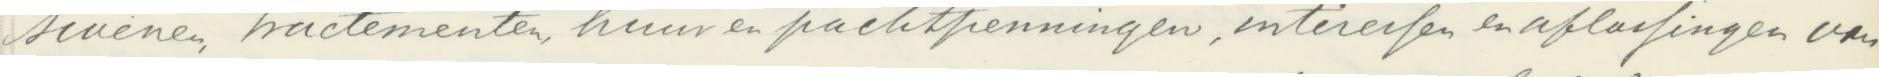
sioenen, tractementen, huur en pachtpenningen, interessen en aflossingen van
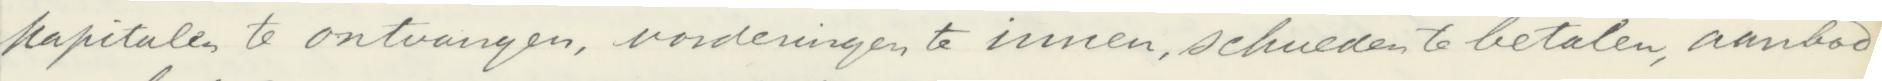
kapitalen te ontvangen, vorderingen te innen, schulden te betalen, aanbod
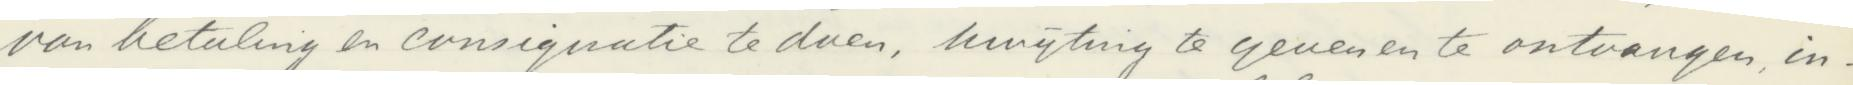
van betaling en consignatie te doen, kwijting te geven en te ontvangen, in
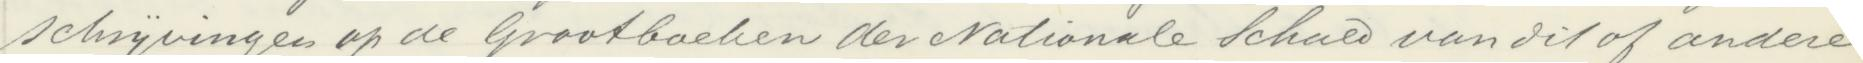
schrijvingen op de Grootboeken der Nationale schuld van dit of andere
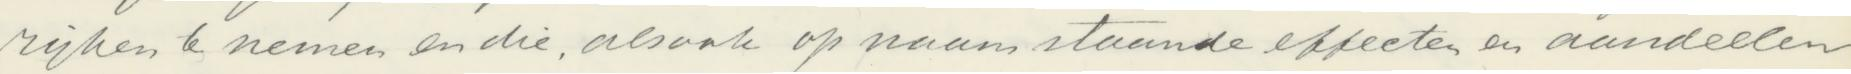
rijken te nemen en die, als ook op naam staande effecten en aandeelen
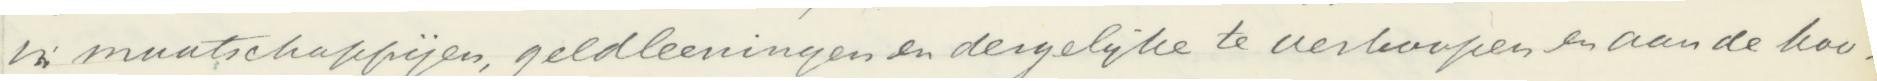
in maatschappijen, geldleeningen en desgelijke te verkoopen en aan de koo
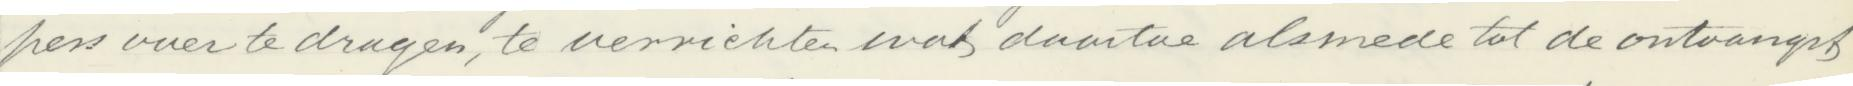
pers over te dragen, te verrichten wat daartoe alsmede tot de ontvangst
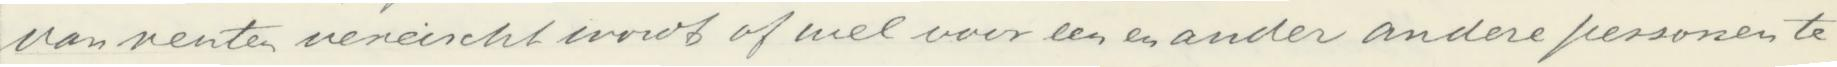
van renten vereischt wordt of wel voor een en ander andere personen te
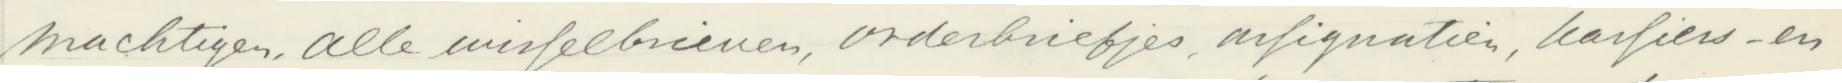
machtigen, alle wisselbrieven, orderbriefjes, assignatien, kassiers - en
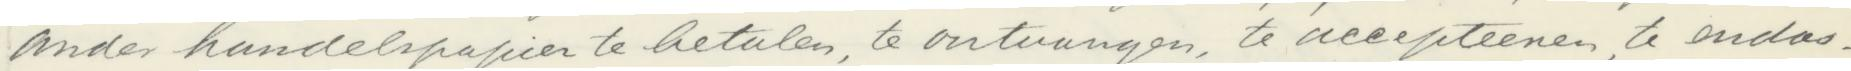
ander handelspapier te betalen, te ontvangen, te accepteeren te endos„
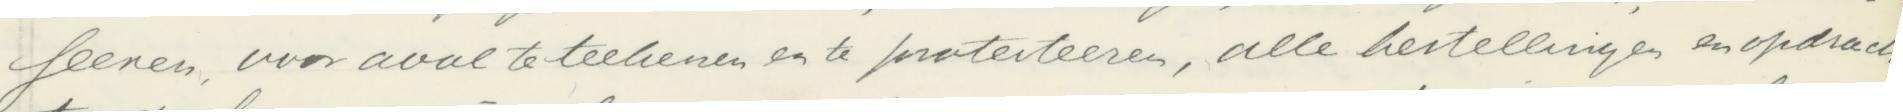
seeren, voor aval te teekenen en te protesteeren, alle bestellingen en opdrach
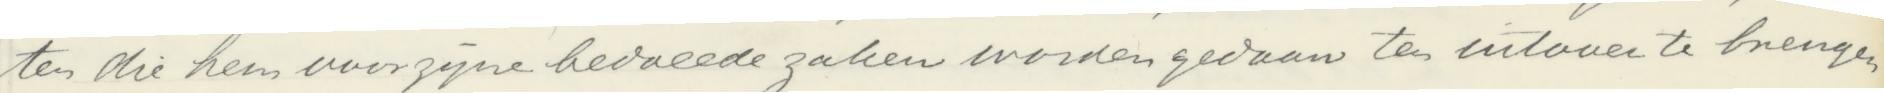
ten die hem voor zijne bedoelde zaken worden gedaan ten uitvoer te brengen
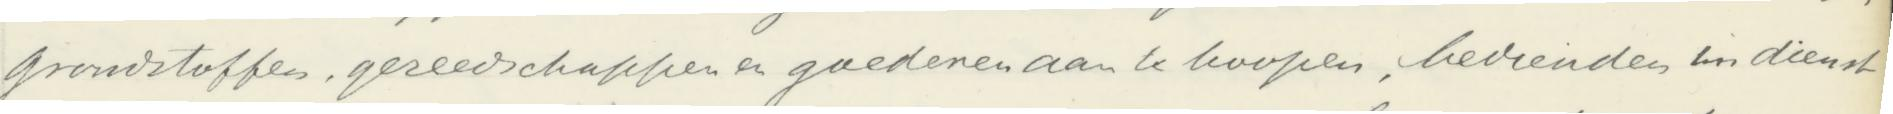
grondstoffen, gereedschappen en goederen aan te koopen, bedienden in dienst
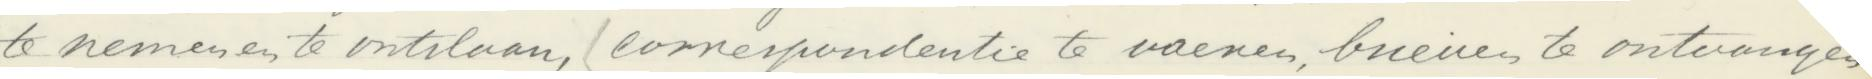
te nemen en te ontslaan, correspondentie te voeren, brieven te ontvangen
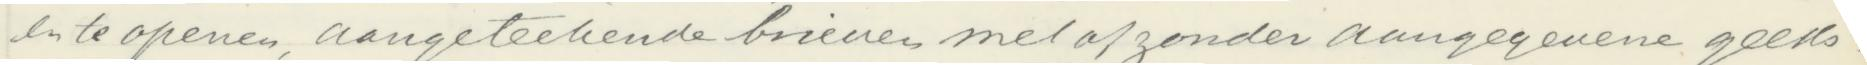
en te openen, aangeteekende brieven met of zonder aangegevene gelds
